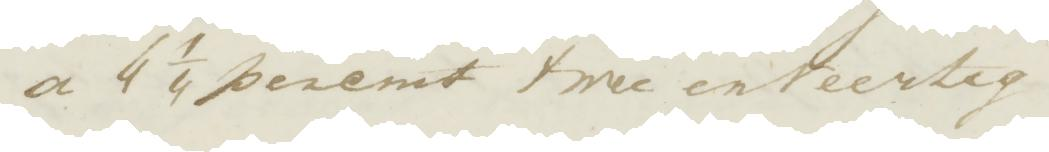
a 4¼ percent twee en Veertig
